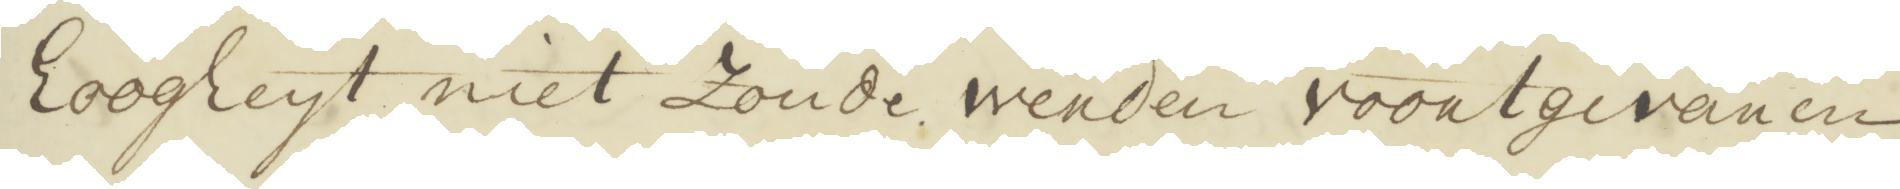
hoogheijt niet zoude werden voortgevaren
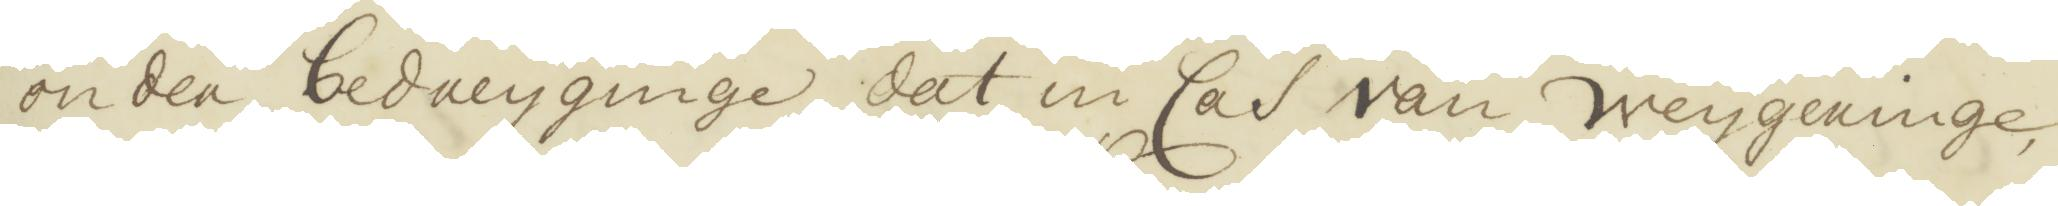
onder bedreijginge dat in Cas van weijgeringe,
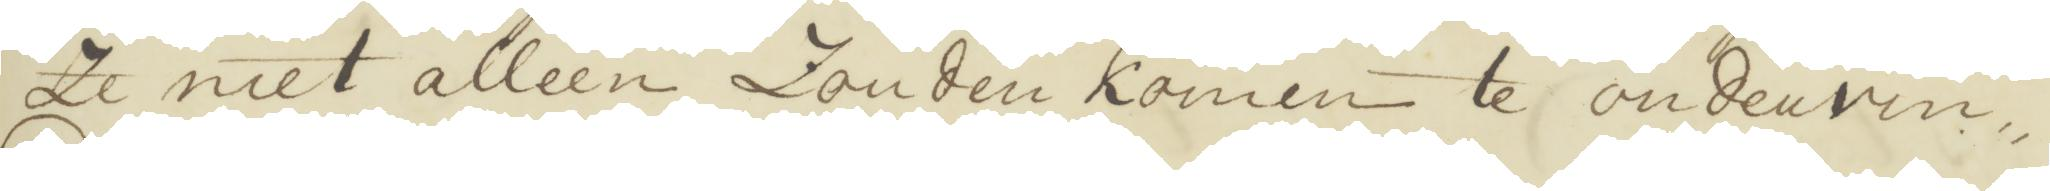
ze niet alleen zouden komen te ondervin„
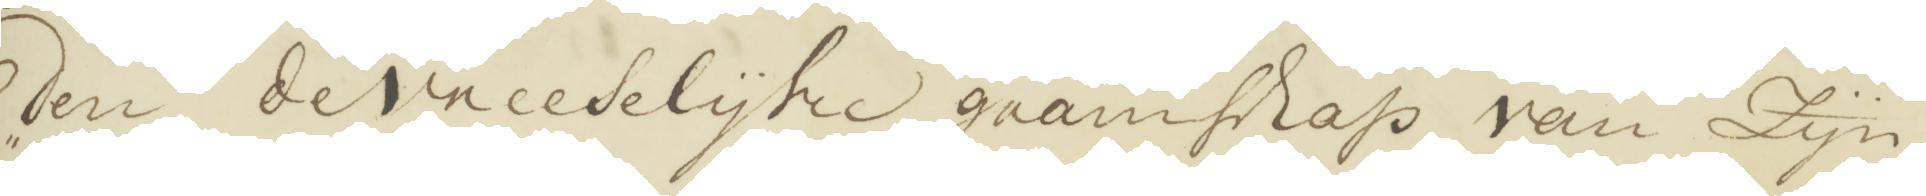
„den, de vreeselijke gramschap van zijn
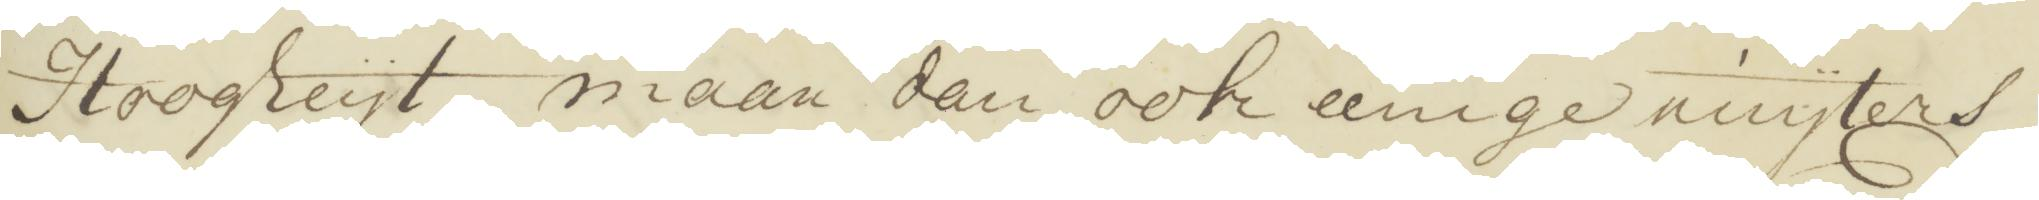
Hoogheijt, maar dan ook eenige ruijters
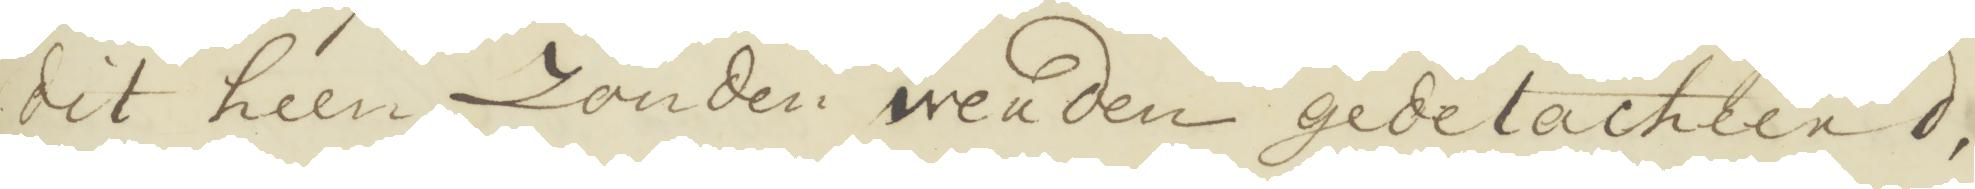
dit heen zouden werden gedetacheerd,
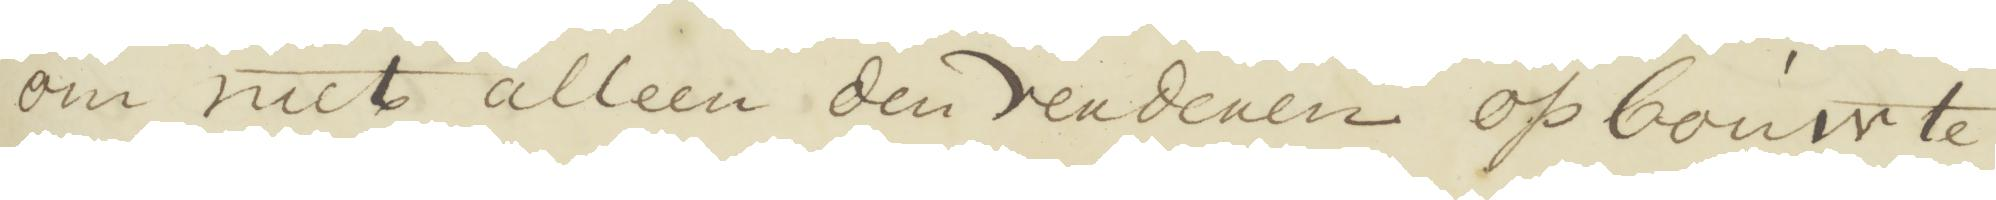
om niet alleen den verderen op bouw te
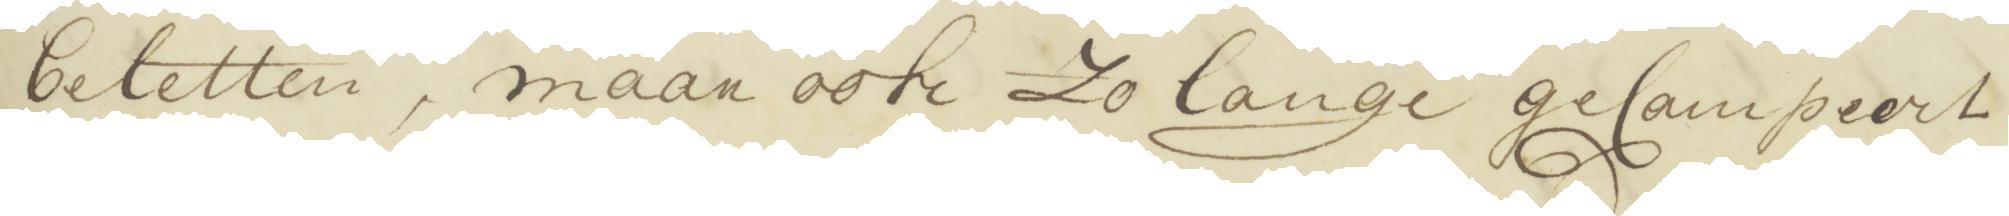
beletten, maar ook zo lange gecampeert
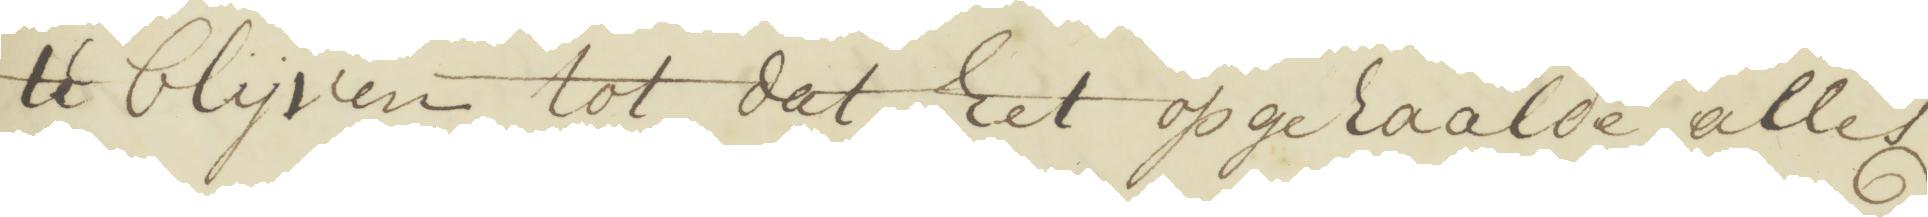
te blijven tot dat het opgehaalde alles
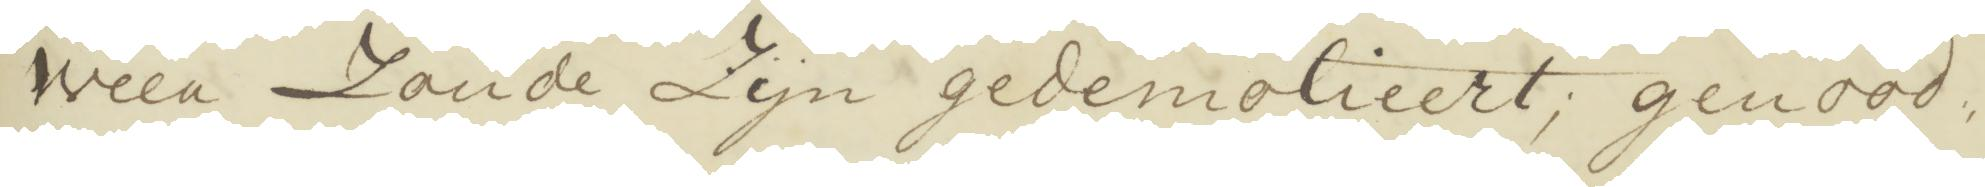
weer zoude zijn gedemolieert; genood„
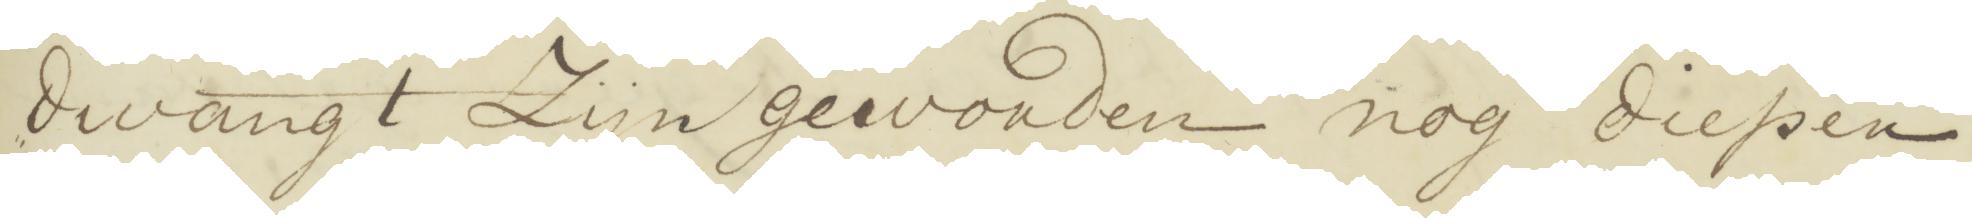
„dwangt zijn geworden nog dieper
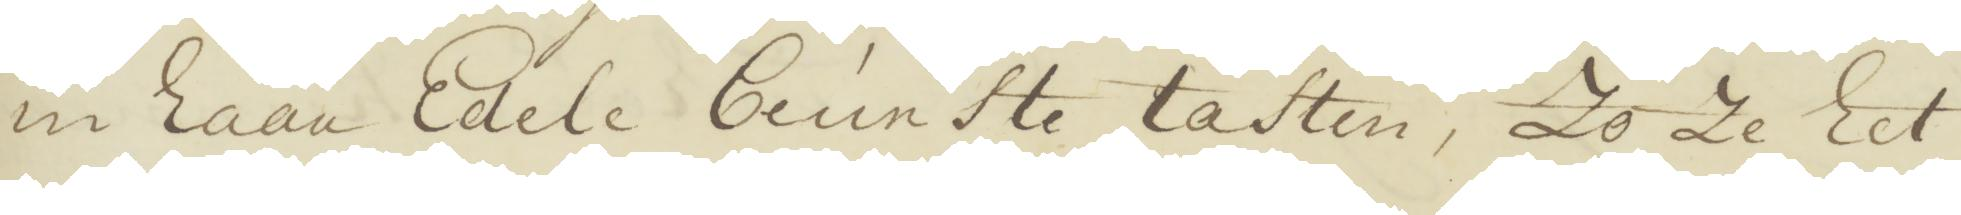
in haar Edele beurste tasten, zo ze het
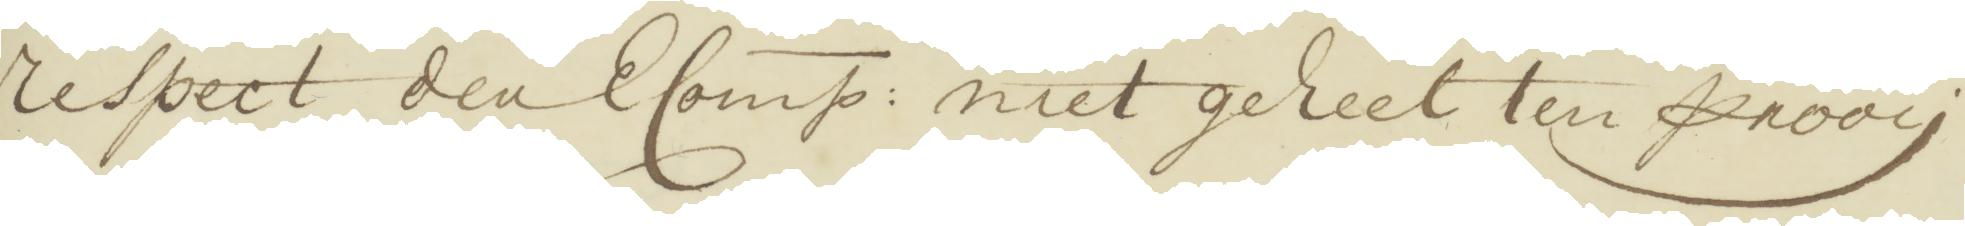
respect der EComp: niet geheel ten prooij
